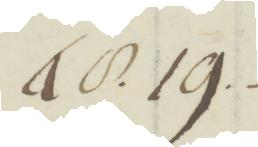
48.19. -.
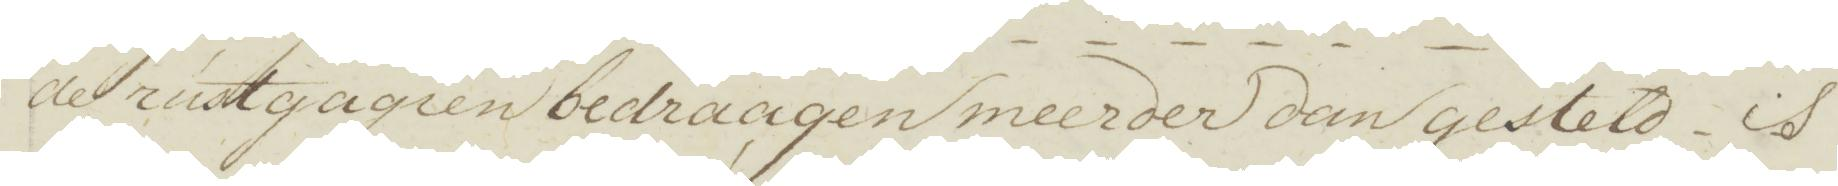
de rustgagien bedraagen meerder dan gesteld is
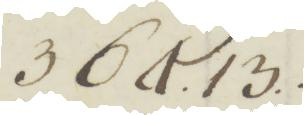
364.13. - .
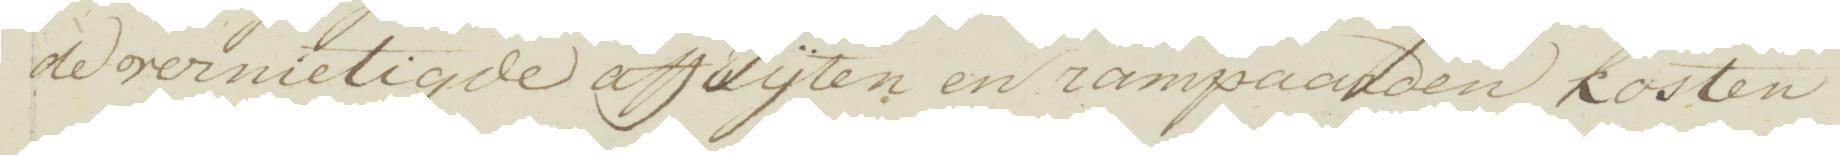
de vernietigde affuijten en rampaarden kosten
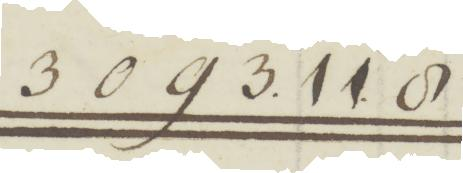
3093.11. 8
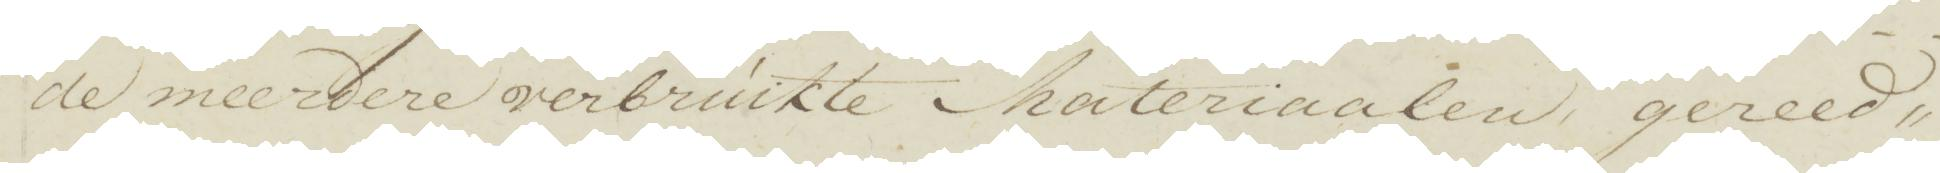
de meerdere verbruikte Materiaalen, gereed„
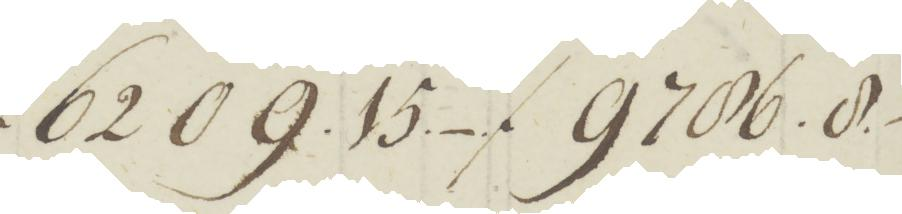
ƒ 6209. 15. - ƒ 9786. 8. -.
